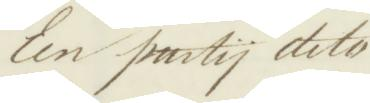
Een partij dito
